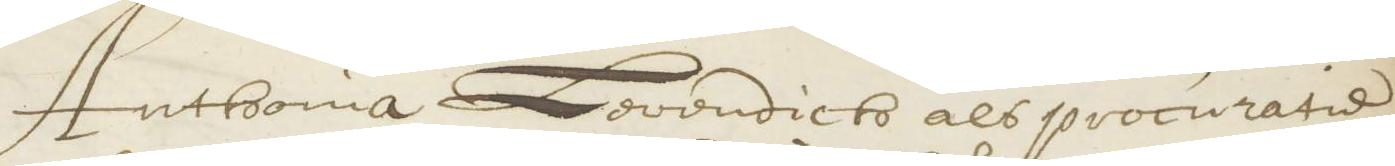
Anthonia Levendich als procuratie
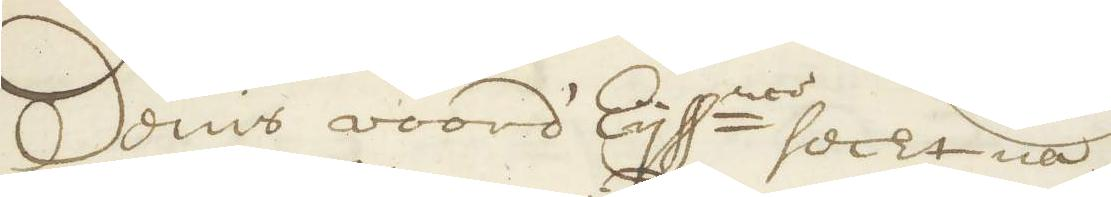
Denis voord' Eijs=rce secht na
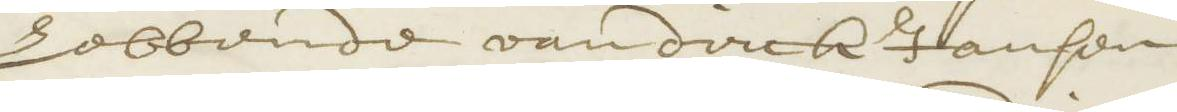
hebbende van dirck Iansen
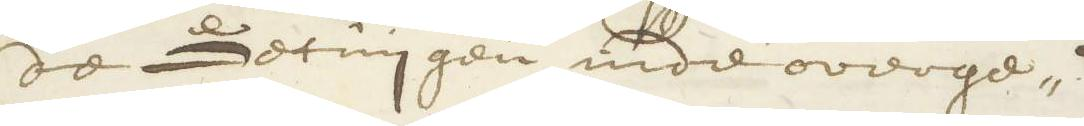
de Getuijgen inde overge„
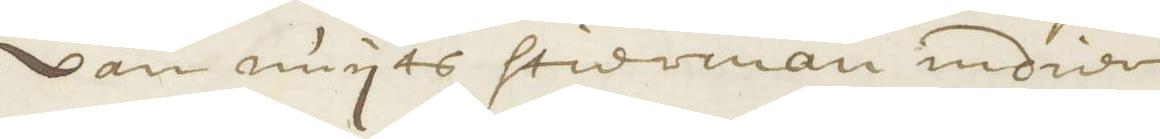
van nuijts stierman indier
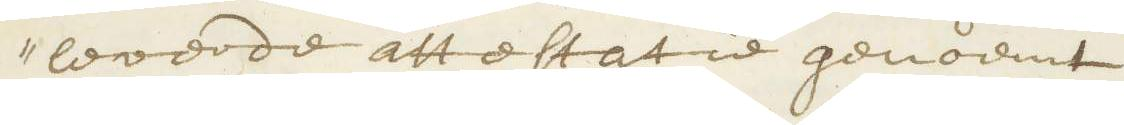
„leverde attestatie genoemt
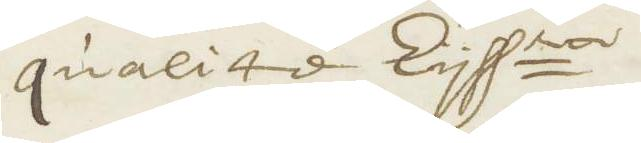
qualite Eijss=rce
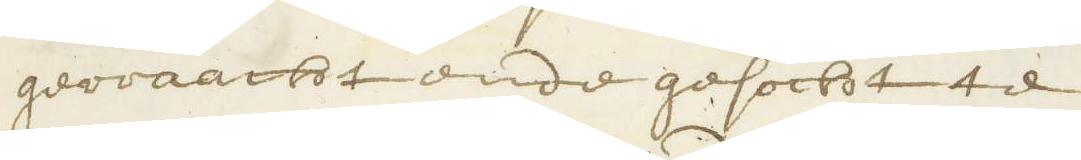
gevraacht ende gesocht te
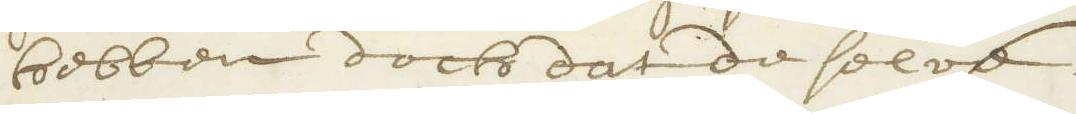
hebben doch dat de selve
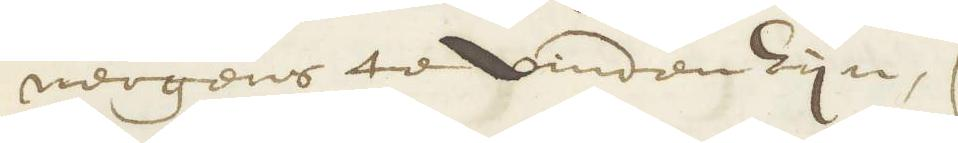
nergens te vinden zijn,
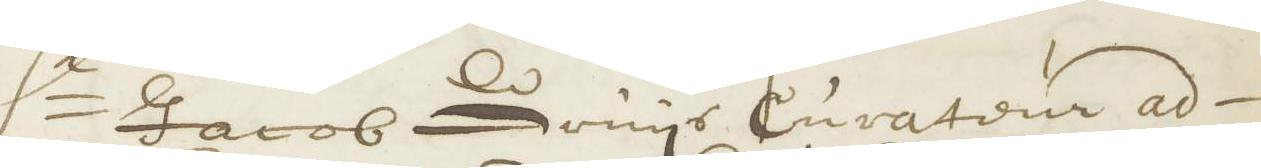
S=r Jacob Gruijs Curateur ad —
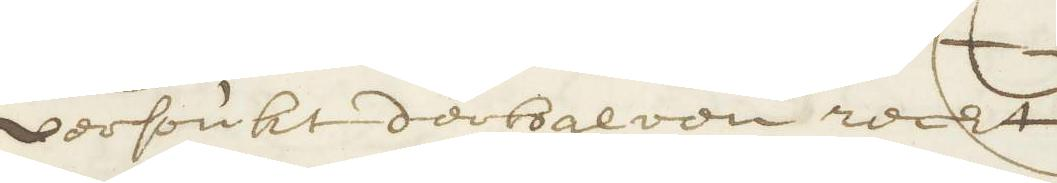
versoukt derhalven recht
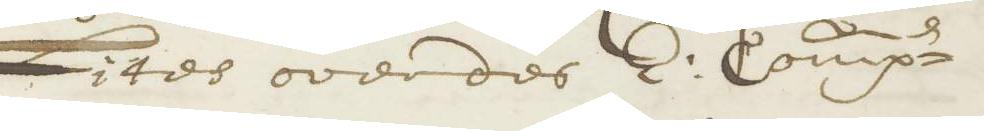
Lites over des E: Comp=s
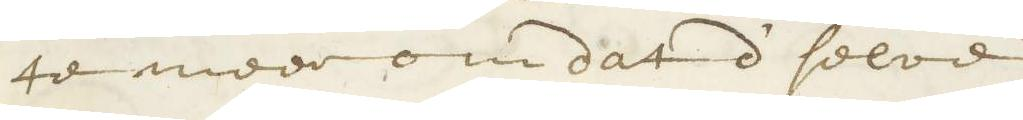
te meer om dat d’ selve
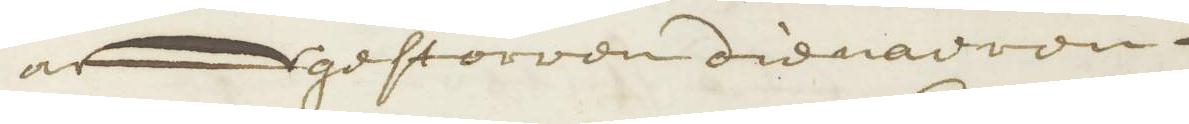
affgestorven dienaeren
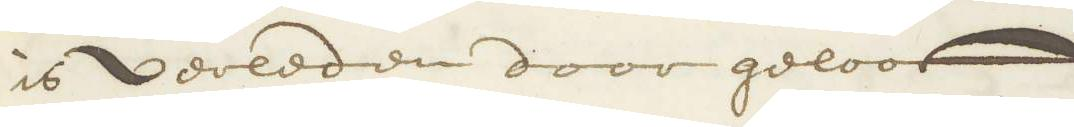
is verleden door gelooff
